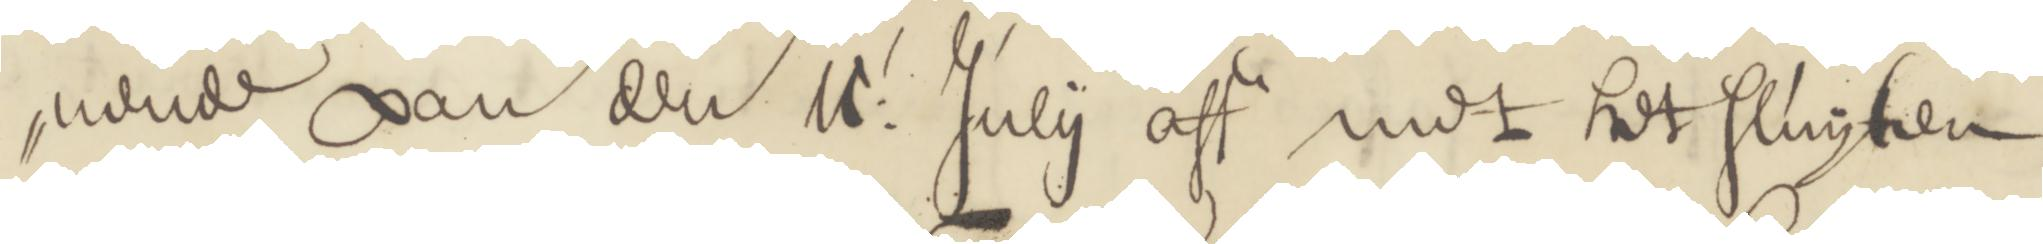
„nende van den 15:' Julij aff met het sluijten
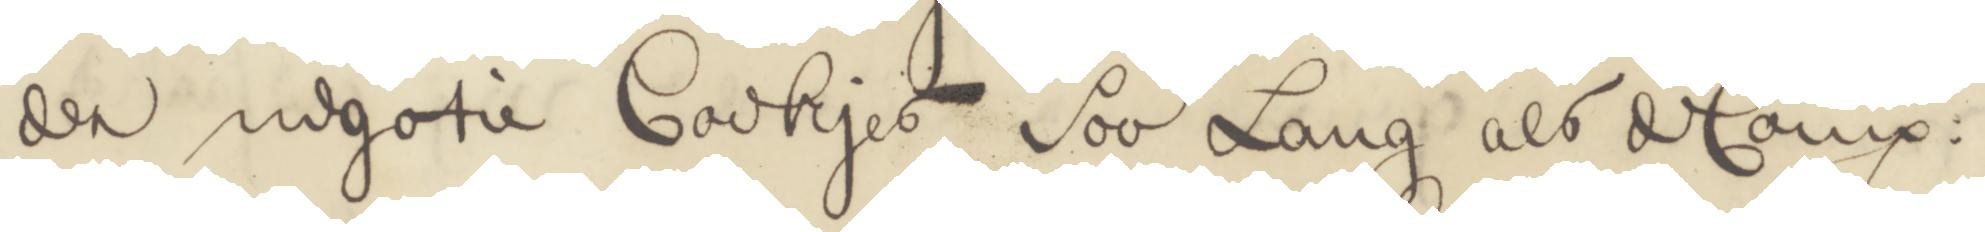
der negotie boekjes soo lang als de Comp:
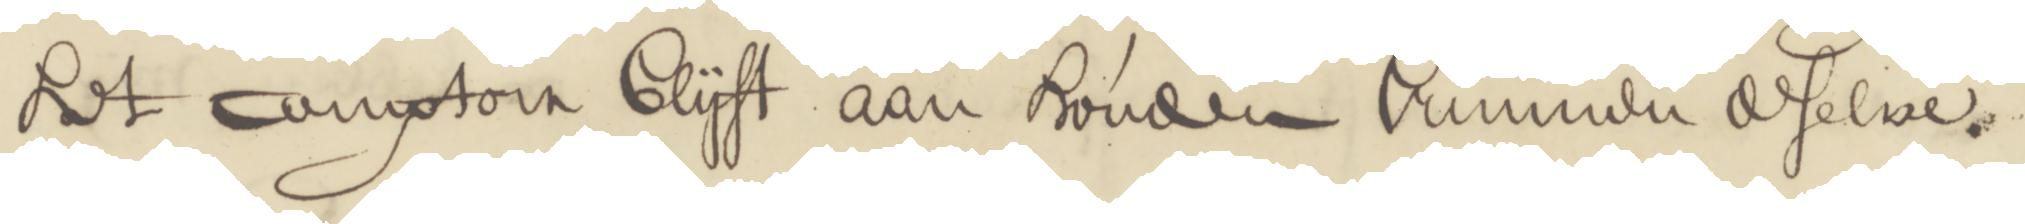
het comptoir blijft aan houden kunnen deselve
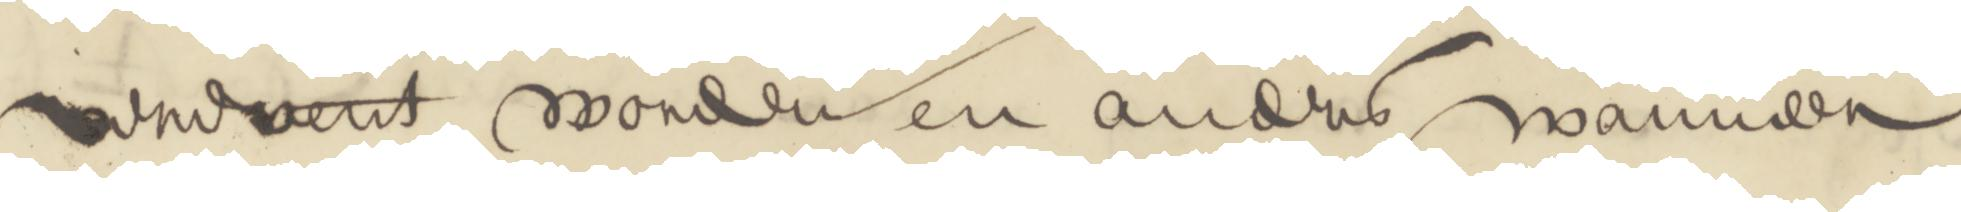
verevent worden en anders wanneer
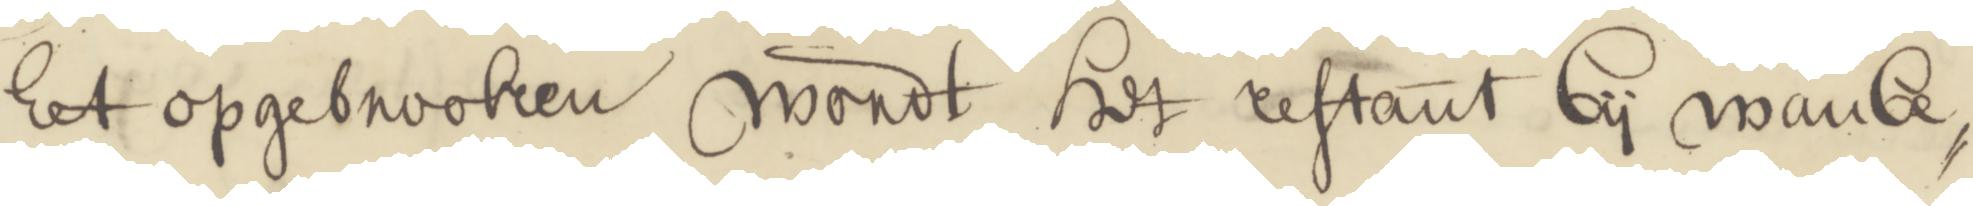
het opgebrooken wordt het restant bij wanbe„
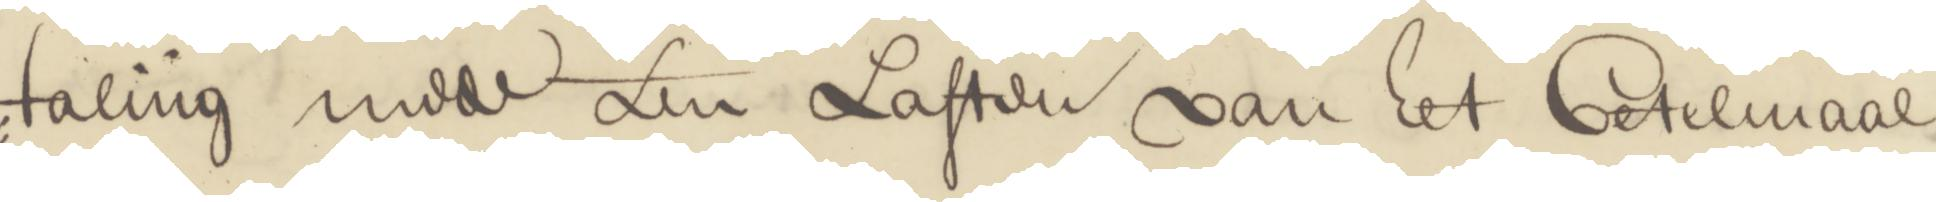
„taling mede ten Lasten van het betelmaal
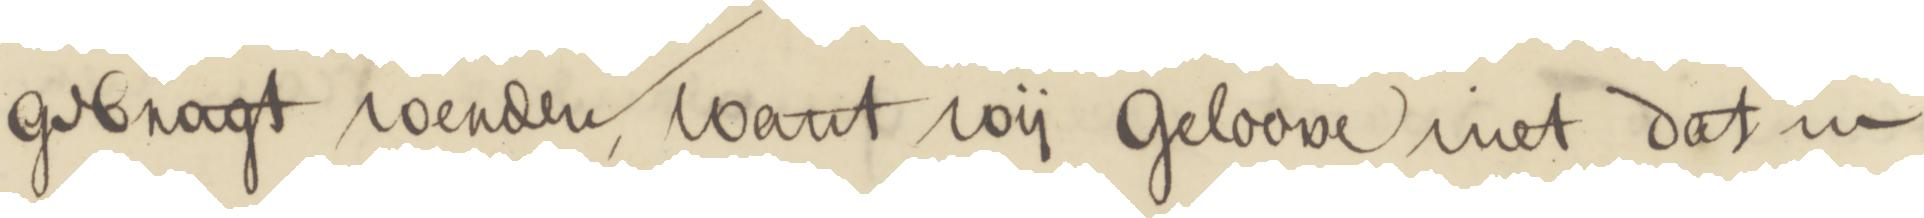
gebragt werden, want wij geloove niet dat in
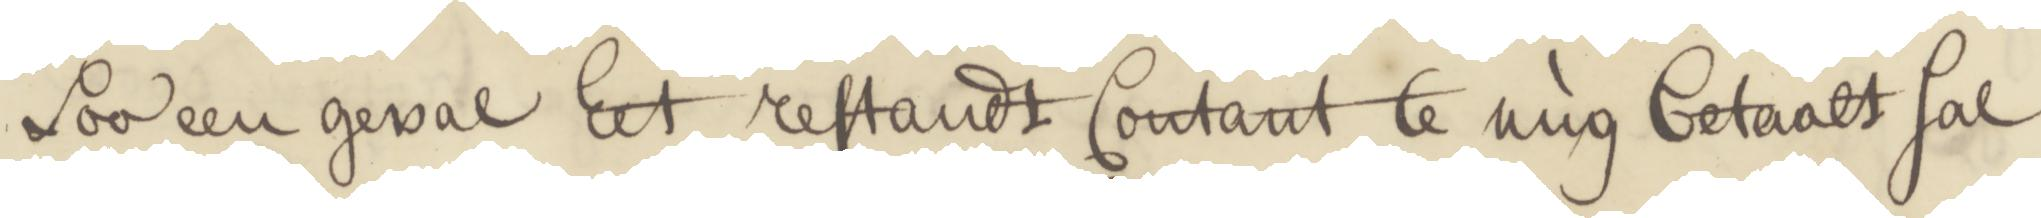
soo een geval het restandt Contant te rug betaalt sal
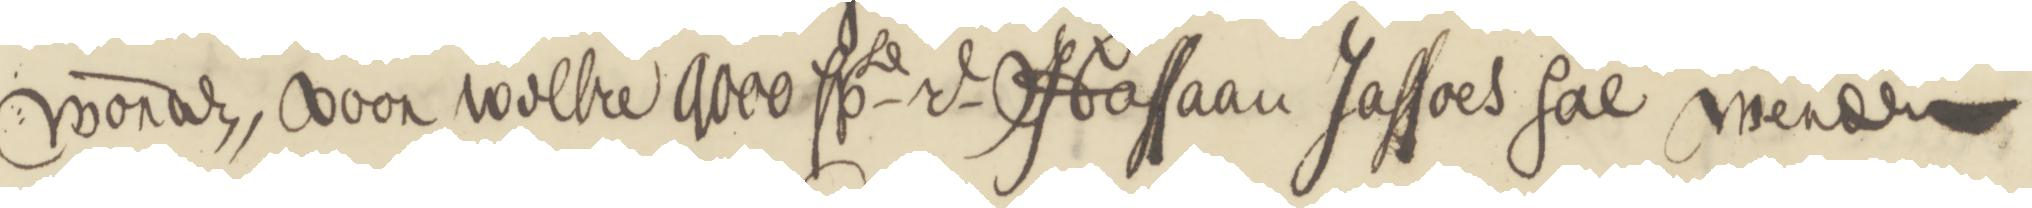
worden, voor welke 4000 sp-se r-l Hassaan Jassoes sal werden
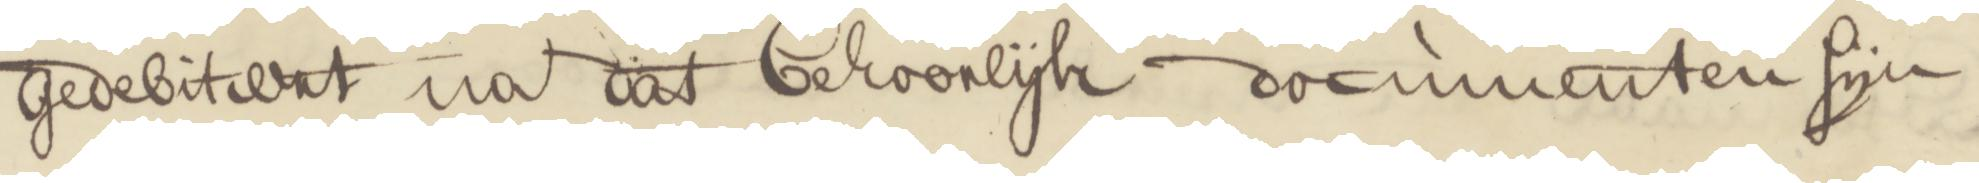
gedebiteert na dat behoorlijk documenten sijn
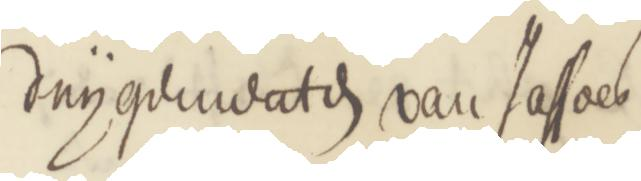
drijgementen van Jassoes
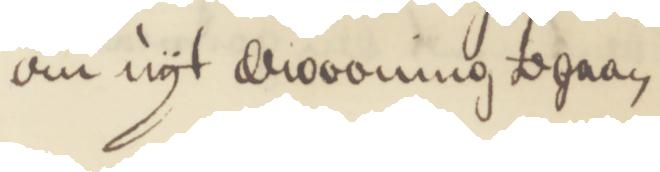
om uijt dewooning te gaan
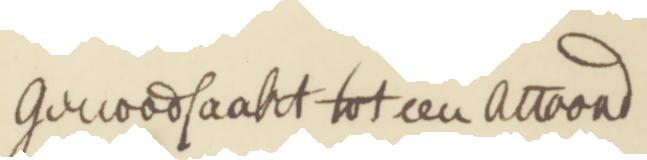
genoodsaakt tot een accoord
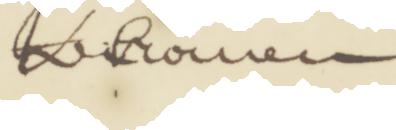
te komen
